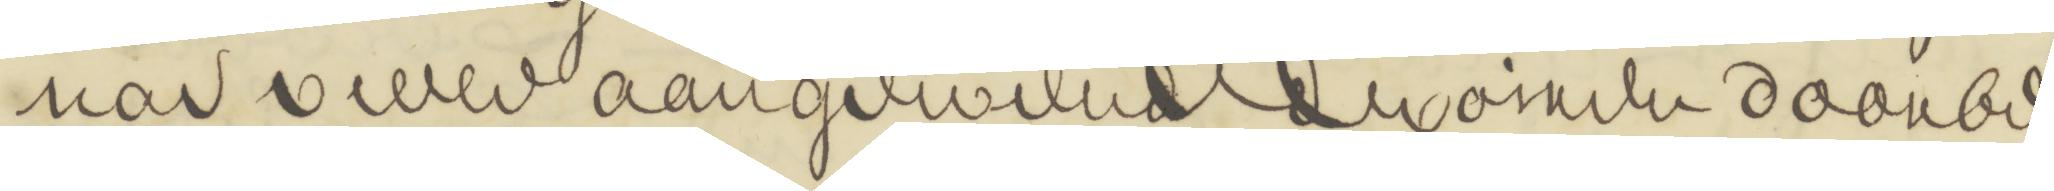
nae veele aangewende devoiren doorbe
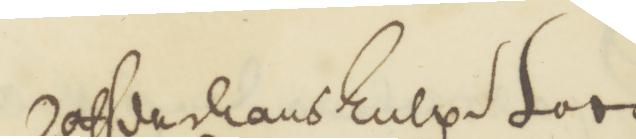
Jafferchans hulpe tot
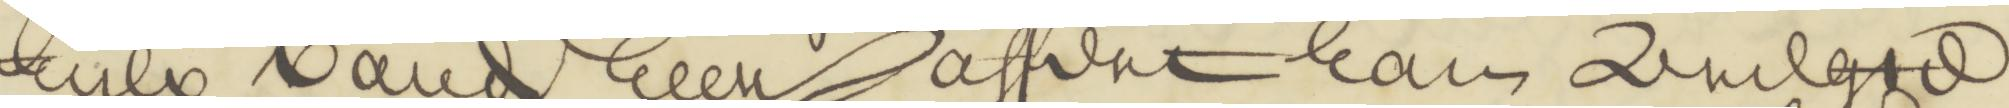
hulp vande heer Jafferchan te regte
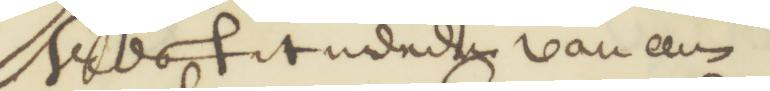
trestitueren van een
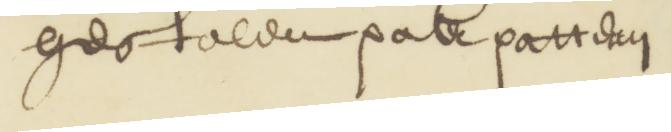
gestolen pak patteny
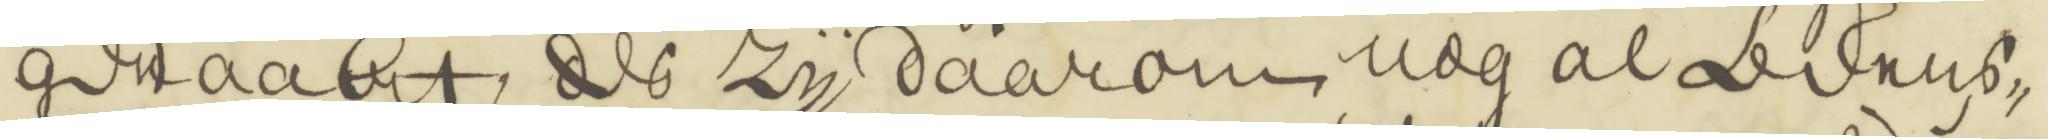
geraakt, des zij daarom nog al te Erns„
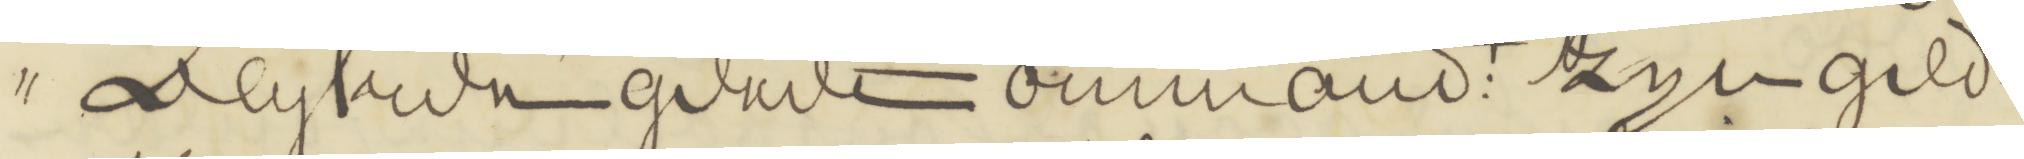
„telijker gerecommand:t zyn ged=s
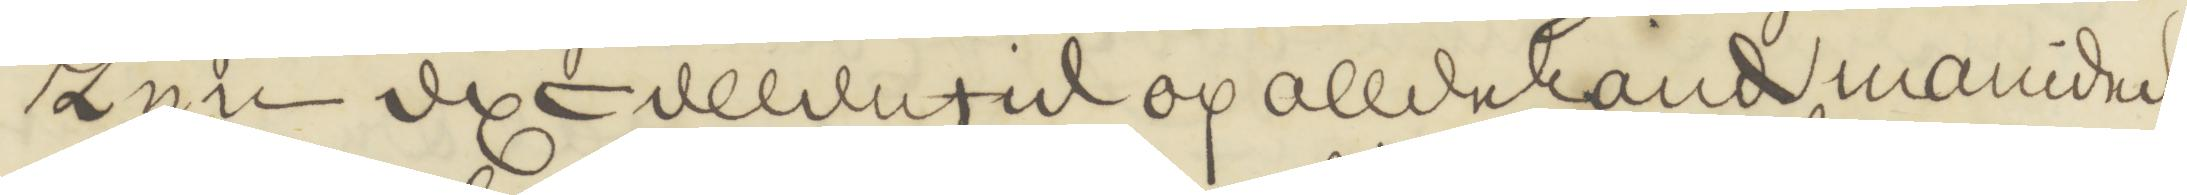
zyn excellentie op allerhande maniere
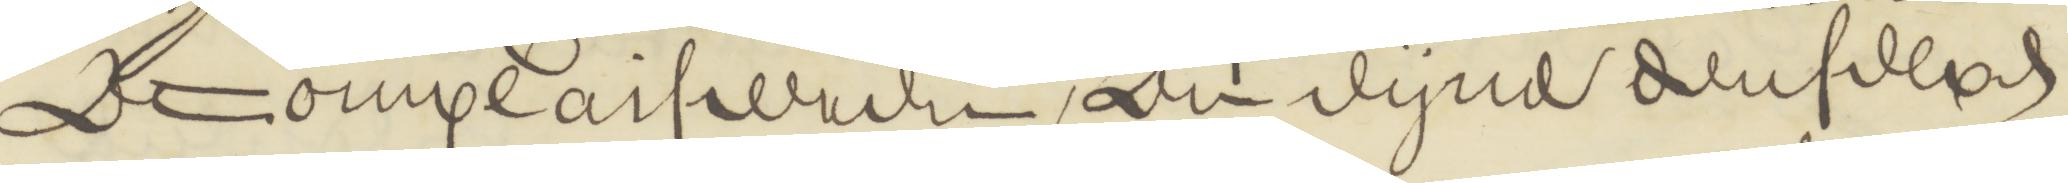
te complaiseeren, ten eijnde denselven
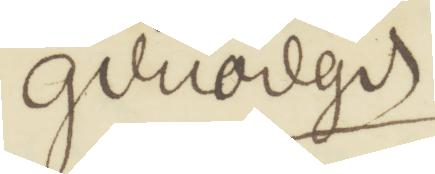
genoegen
